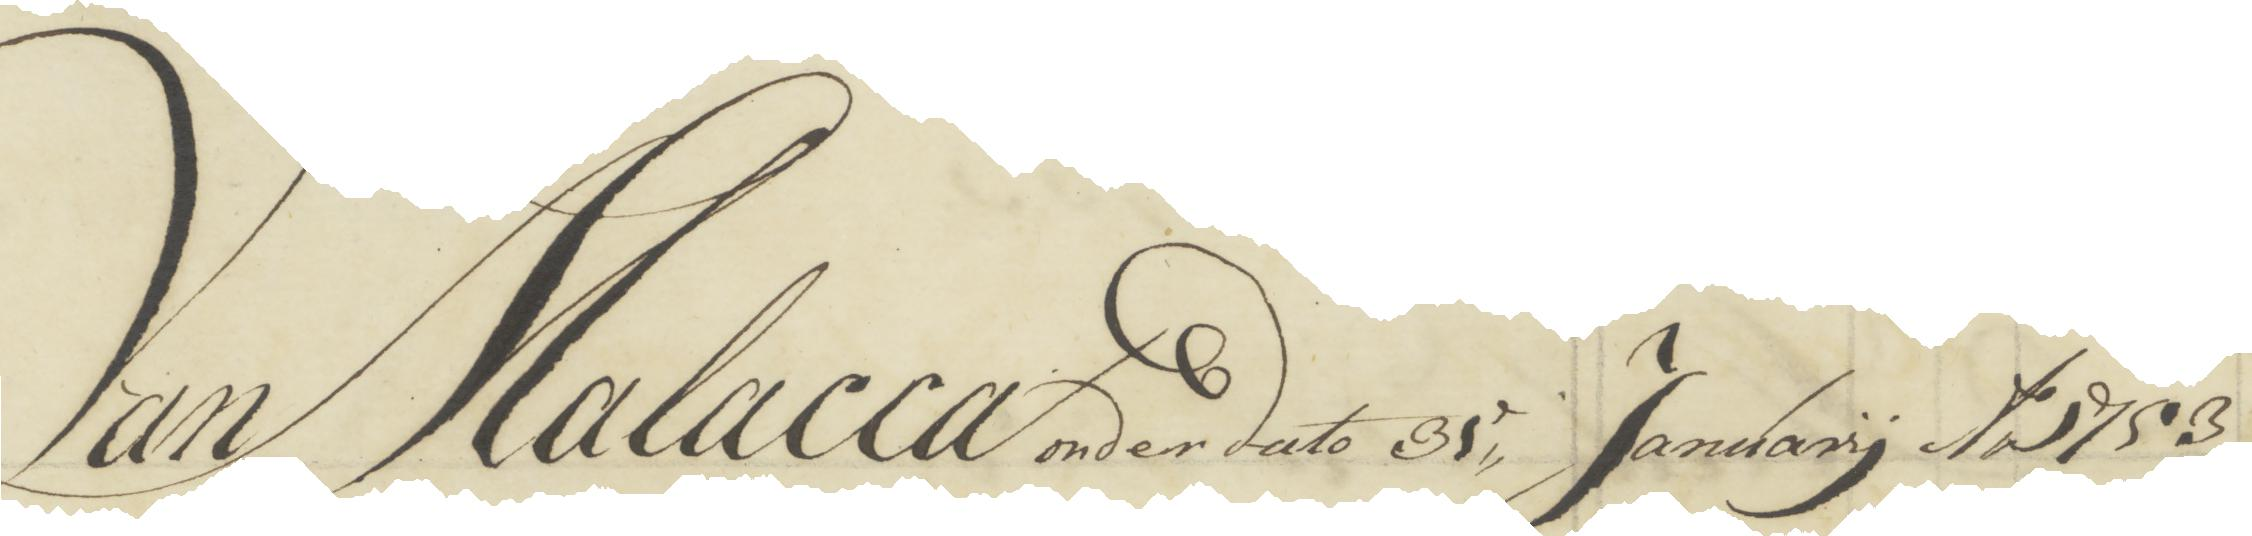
Van Malacca onder dato„' Januarij A„o 1753
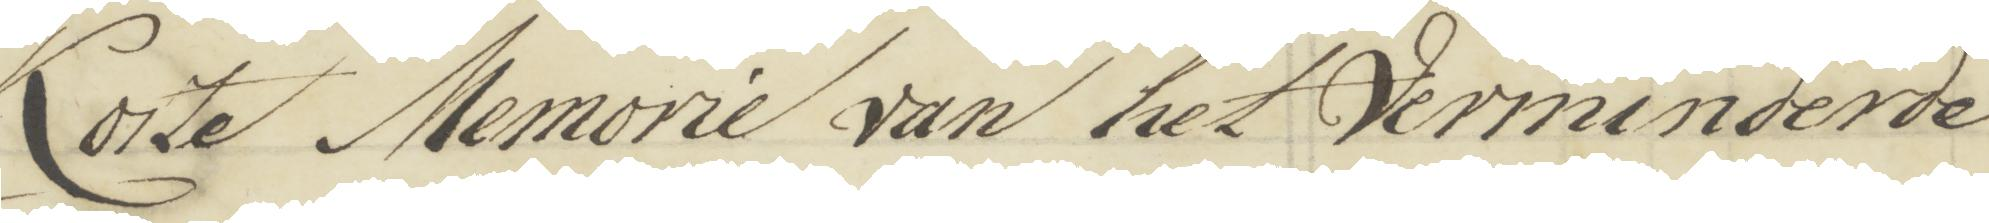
Korte Memorie van het verminderde
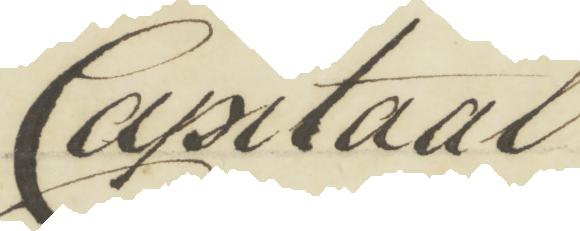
Capitaal
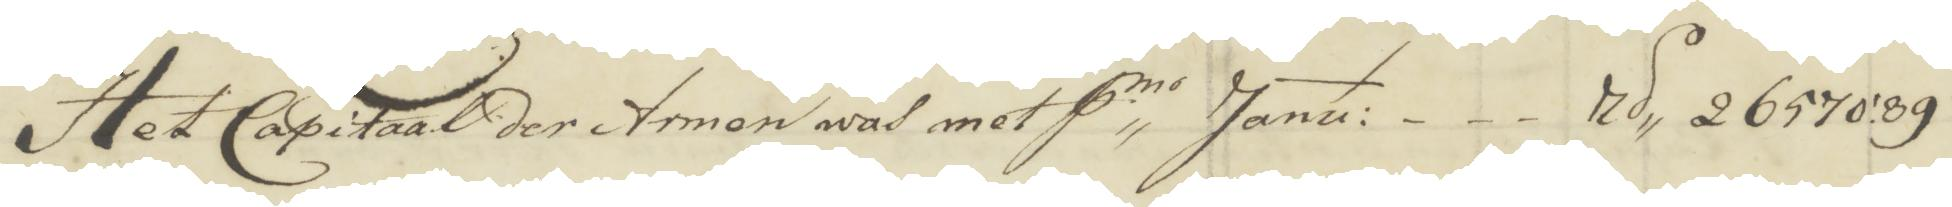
Het Capitaal der Armen was met p„mo Janu: - - - rd„s 26570:39:¾
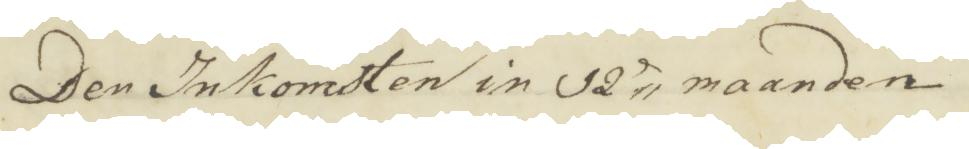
Den Jnkomsten in 12„' maanden
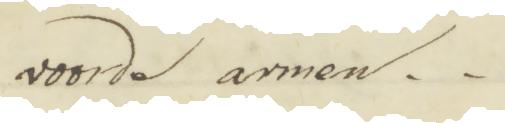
voorde armen - - - - - - - - - - - - rd„s 28: – : –
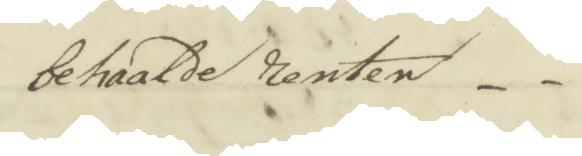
behaalde renten - - - - - - - - - :„ 1498: 8 – „ 1522: 8: –
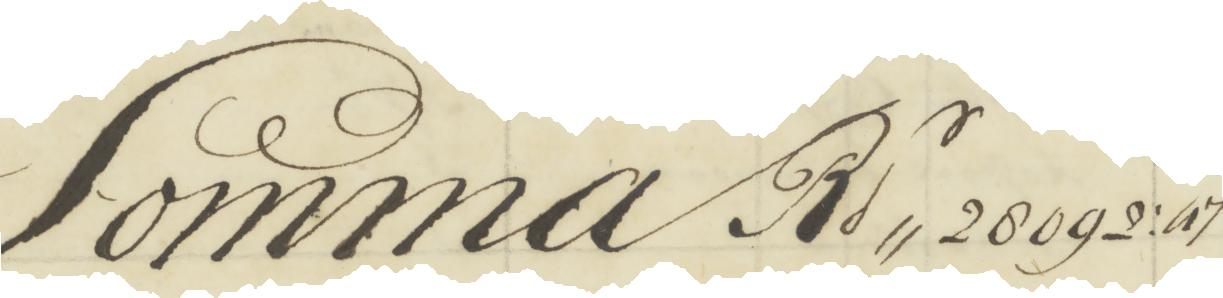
Somma Rd„s 28092:47:¾
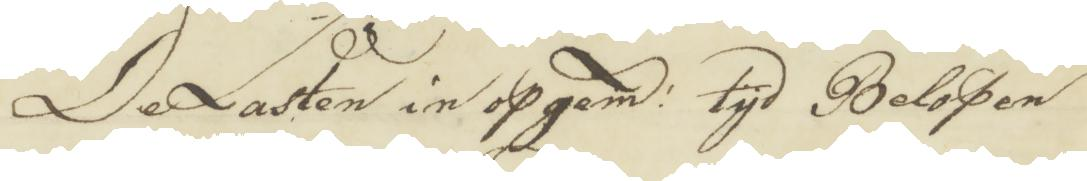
De Lasten in opgem: tijd Belopen
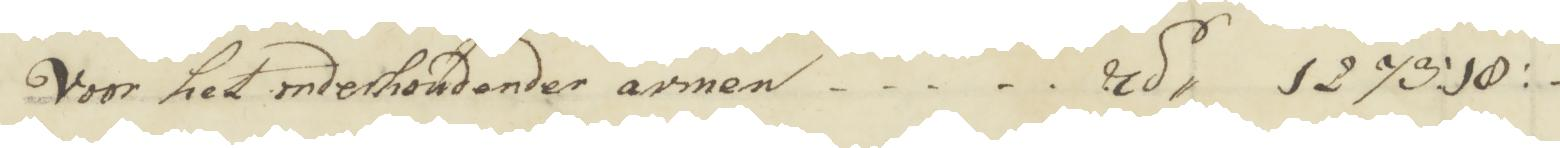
Voor het onderhouden der armen - - - - - rd„s 1273:18: –
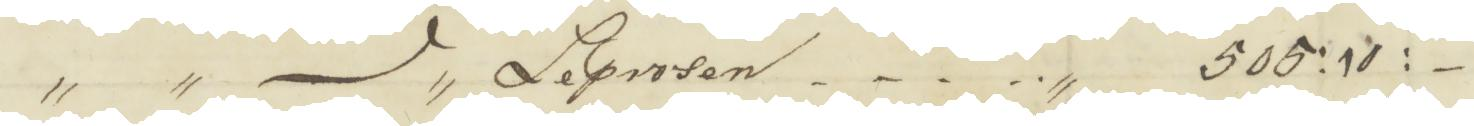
„ „ „ _„o Leprosen - - - - - „ 505: 10: –
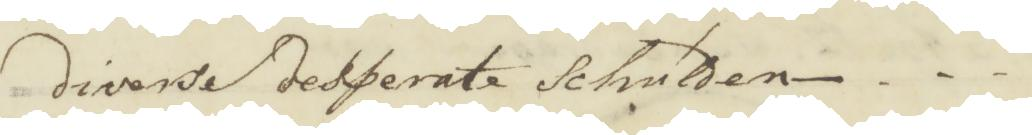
diverse desperate schulden - - - - - . „ 246:33: – „ 2035:13: –
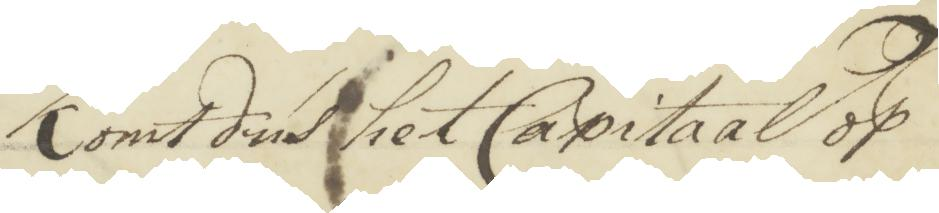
komt dus het Capitaal op - - - - - - rd„s 26057:34:¾
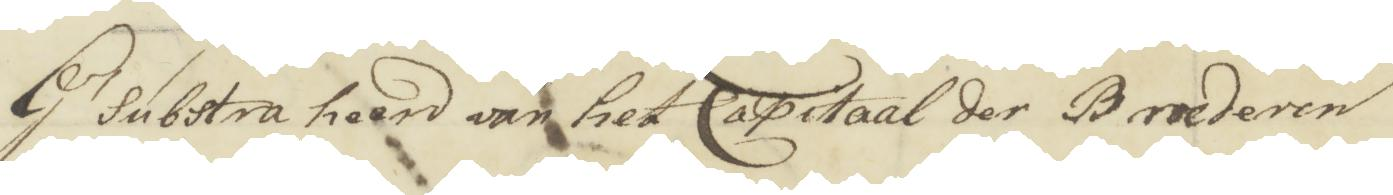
G’substraheerd van het Capitaal der Broederen
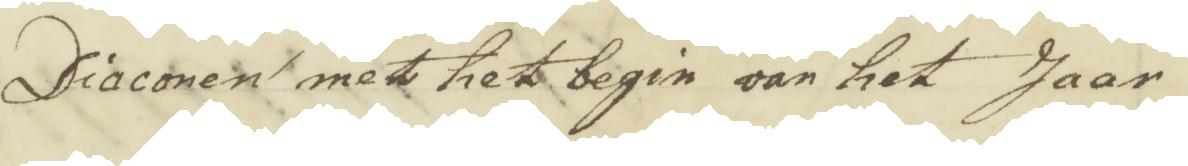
Diaconen met het begin van het Jaar
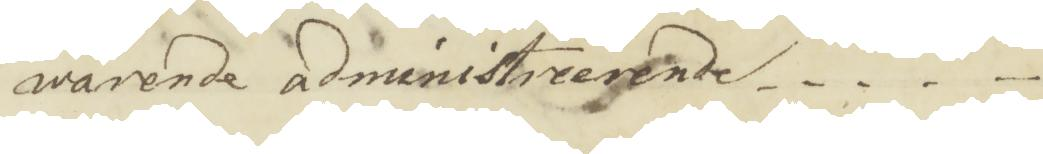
warende administrerende - - - - - - - - - - - - - - „ 26570:39 ¾
